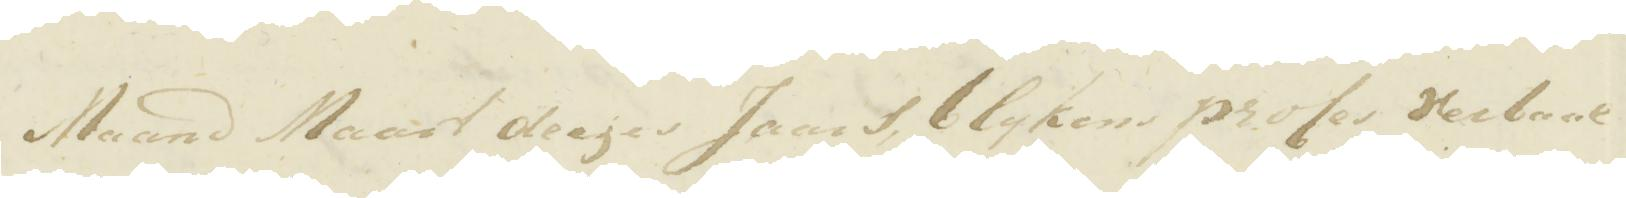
Maand Maart deezes Jaars, blykens proces verbaal
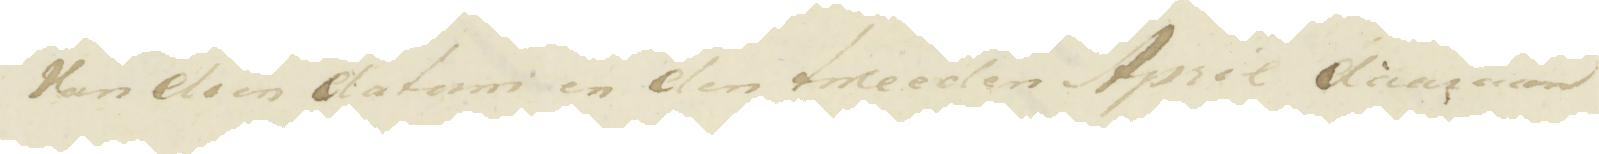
van dien datum den tweeden April daaraan
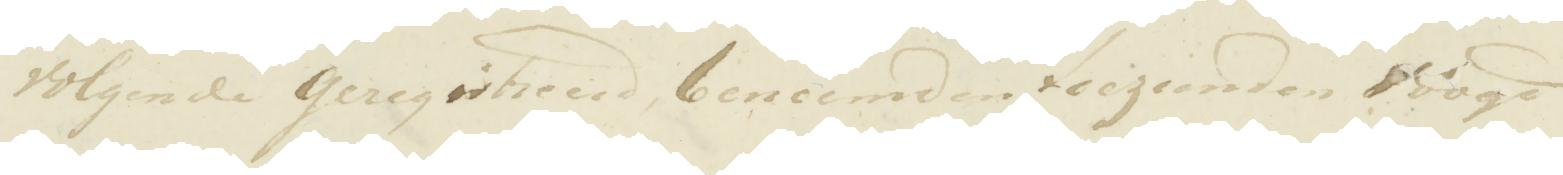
volgende geregistreerd, benoemden toezienden Voogd
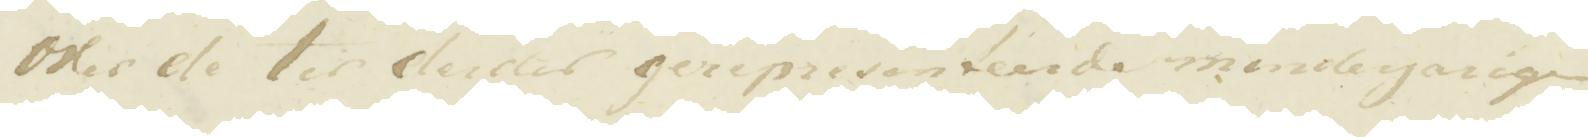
Over de ter derder gerepresenteerde minderjarige
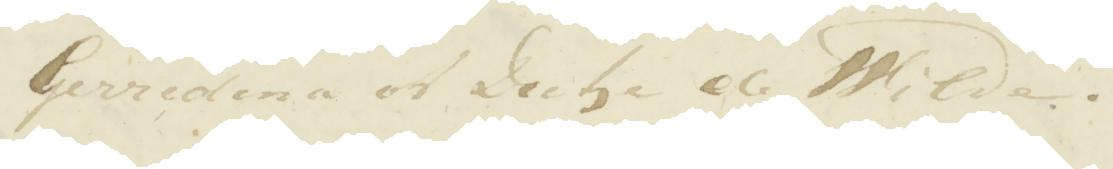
Gerredina of Dietje de Wilde.
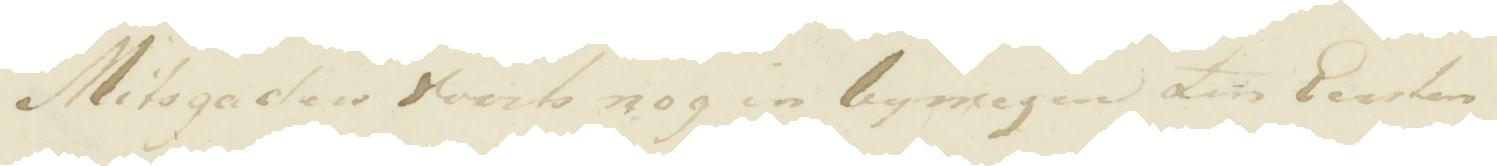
Mitsgaders voorts nog in bywezen ten Eersten
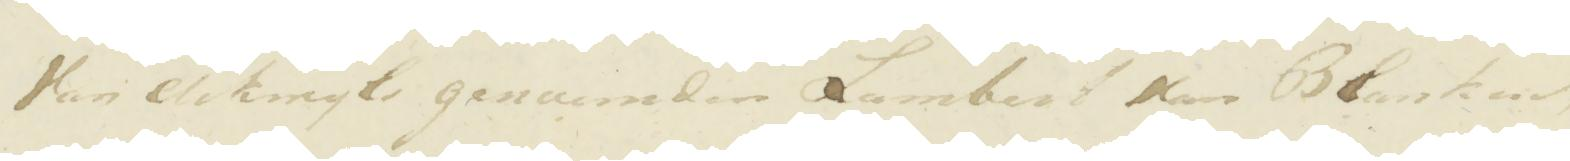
Van dikwyls genoemden Lambert van Blanken,
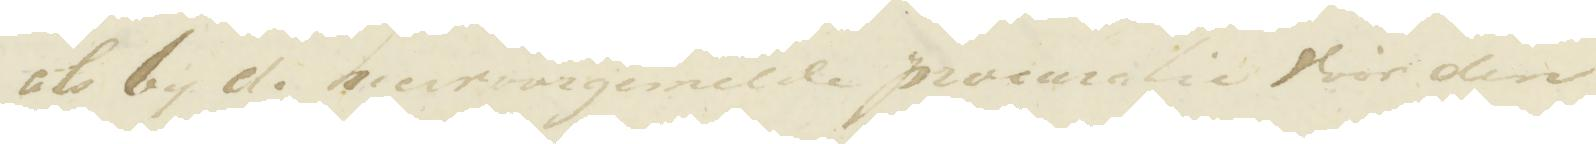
als bij de hiervoorgemelde procuratie voor den
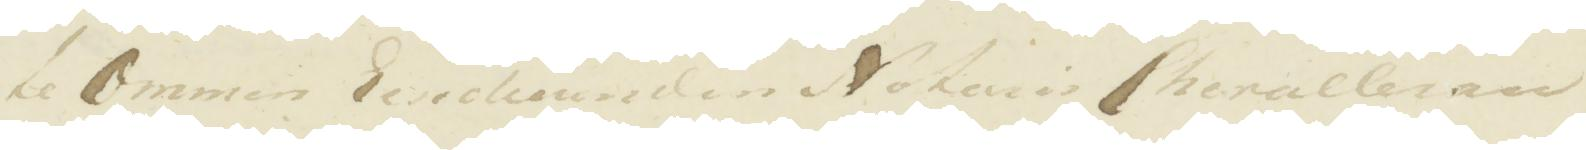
te Ommen resideerenden Notaris Chevallerau
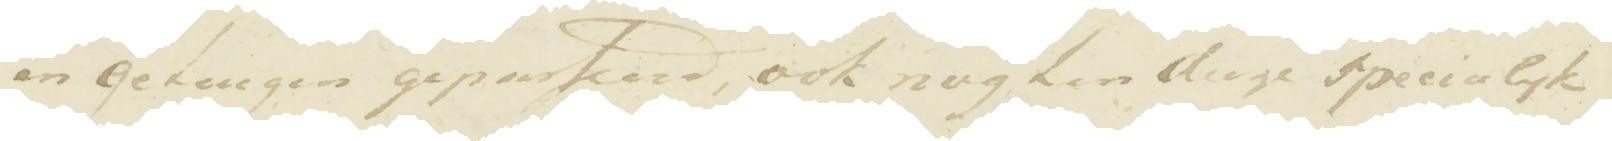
en getuigen gepasseerd, ook nog ten deeze specialyk
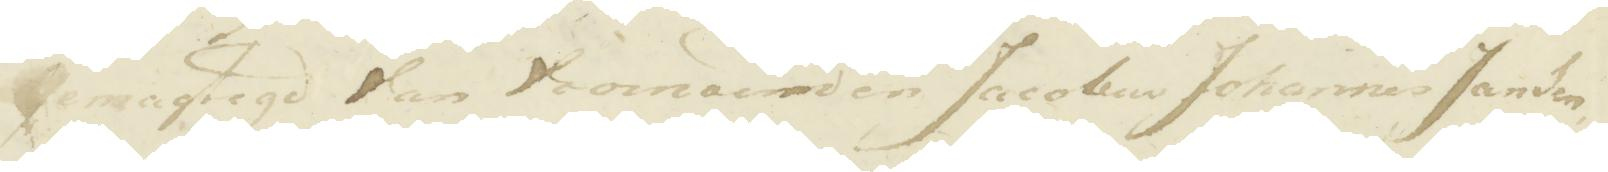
gemagtigd van voornoemden Jacobus Johannes Jansen,
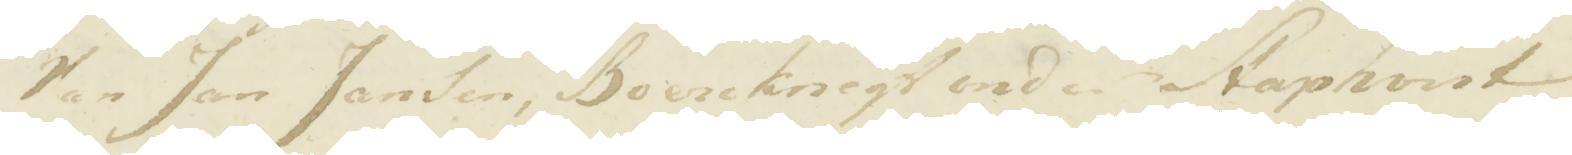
van Jan Jansen, Boereknegt inde Staphorst,
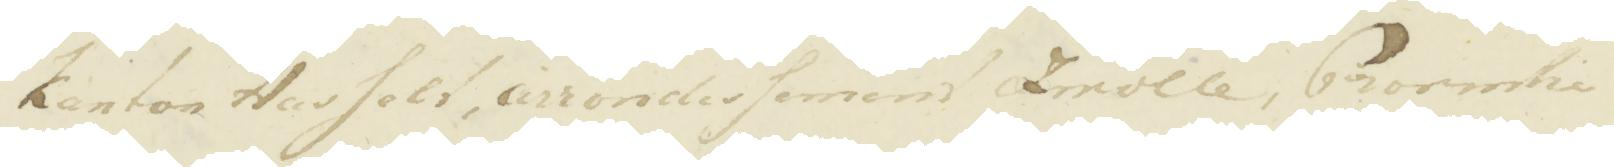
Kanton Hasselt, arrondissement Zwolle, Provintie
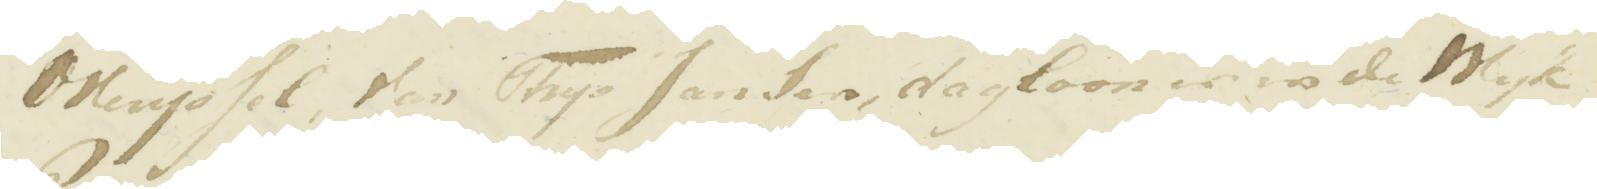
Overyssel, van Thys Jansen, daglooner in de Wyk
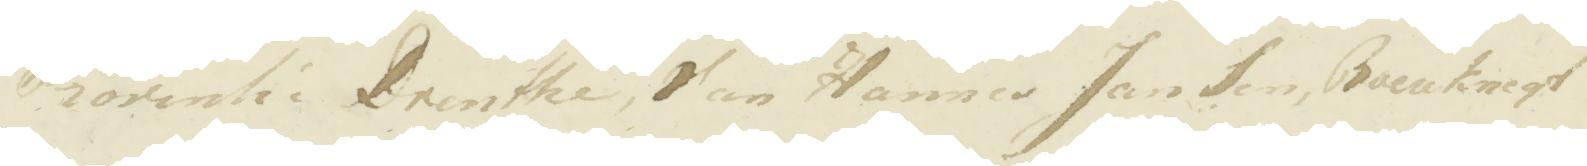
Provintie Drenthe, van Hannes Jansen, Boereknegt
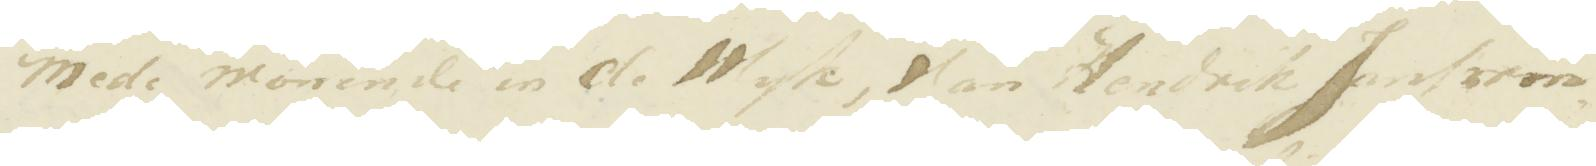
mede wonende in de Wyk, Van Hendrik Jans win„
